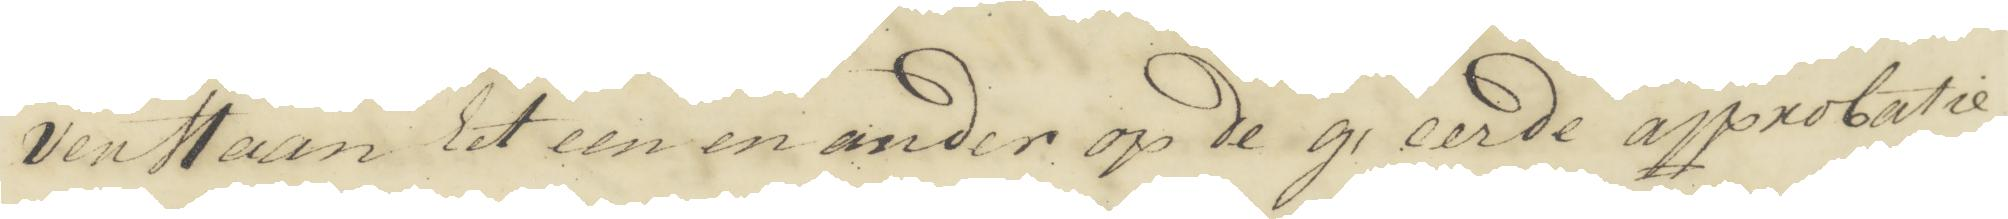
verstaan het een en ander op de g,eerde approbatie
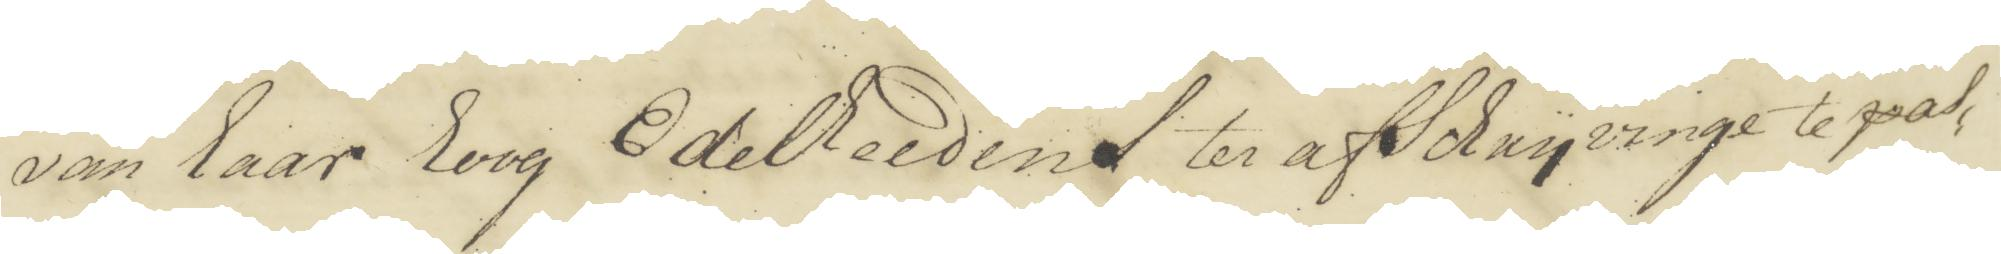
van haar hoog Edelheedens ter afschrijvinge te pas„
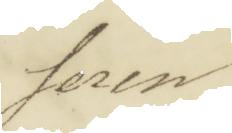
seren
